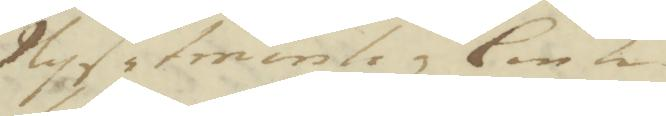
Vyf en twintig Cents
